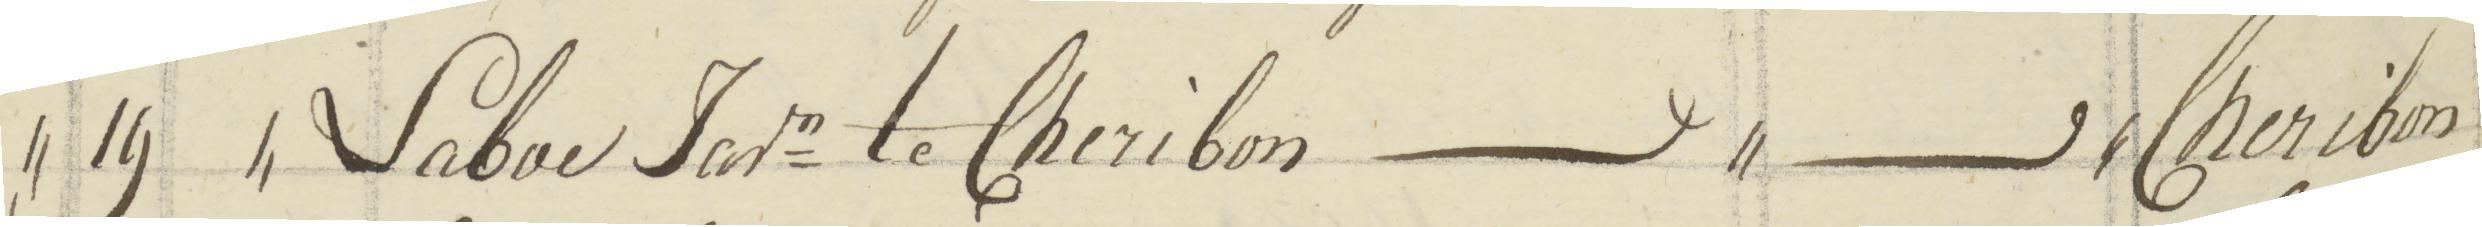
„ 19 „ Saboe Iav=n te Cheribon Do „ Do „ Cheribon
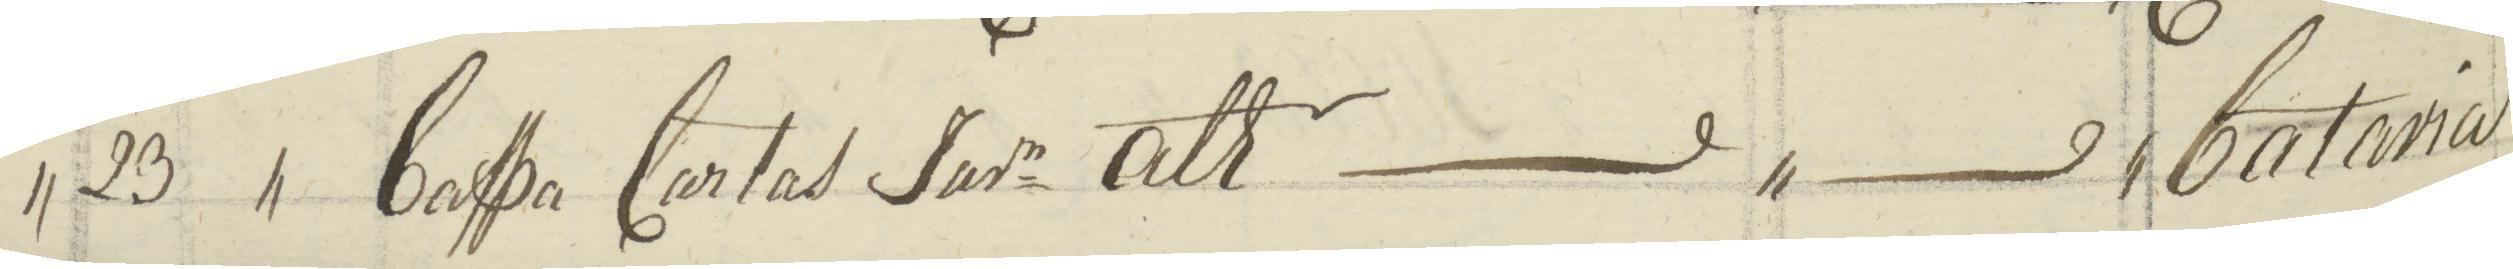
„ 23 „ Bappa Cartas Iav=n alhr Do „ Do „ batavia
